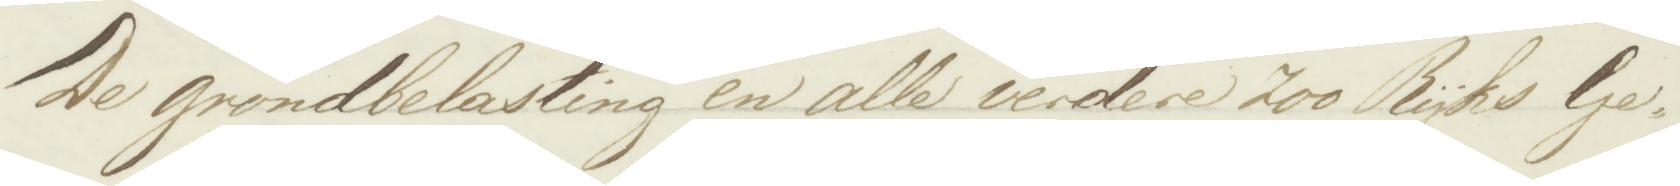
De grondbelasting en alle verdere zoo Rijks Ge„
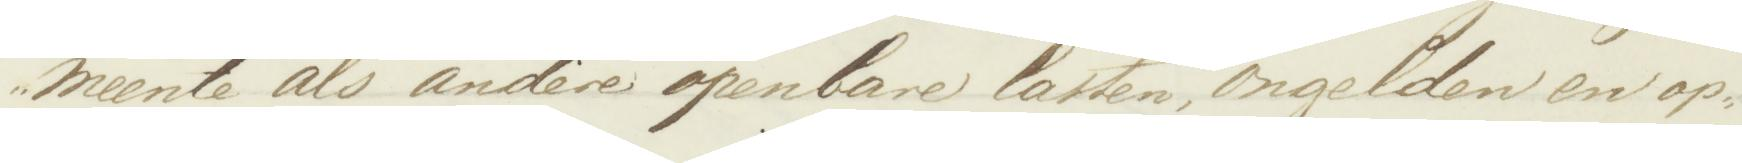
„meente als andere openbare lasten, ongelden en op„
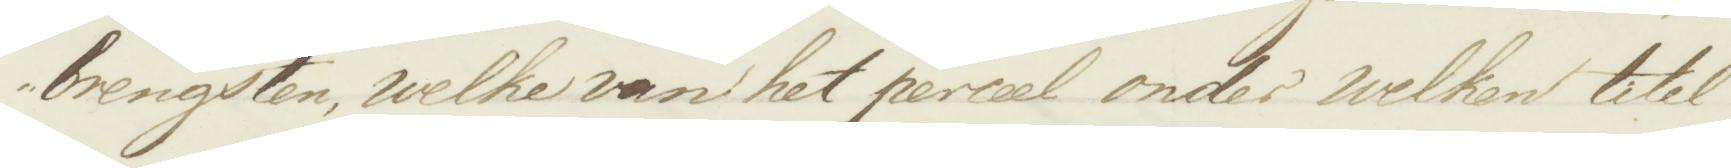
„brengsten, welke van het perceel onder welken titel
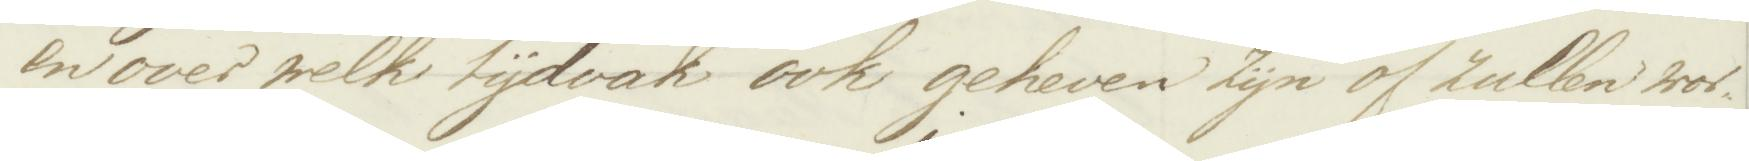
en over welk tijdvak ook geheven zijn of zullen wor„
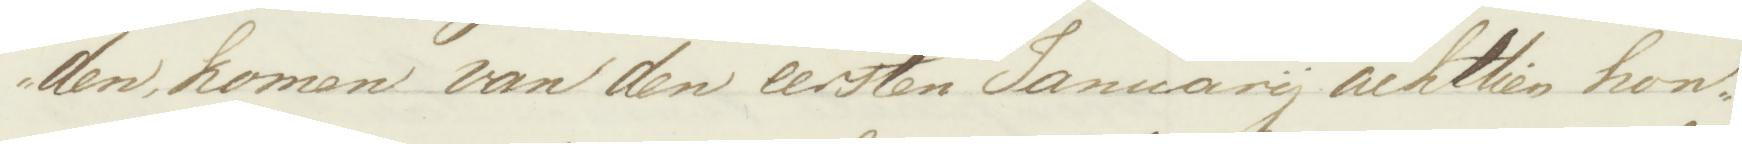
„den, komen van den eersten Ianuarij achttien hon„
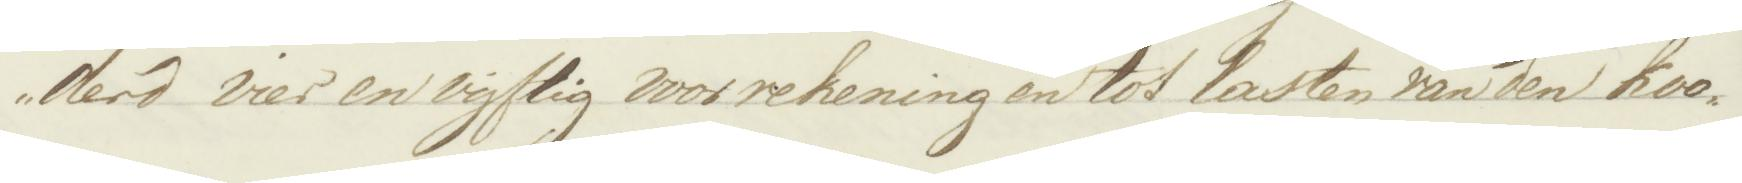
„derd vier en vijftig voor rekening en tot lasten van den koo„
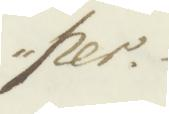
„per. —
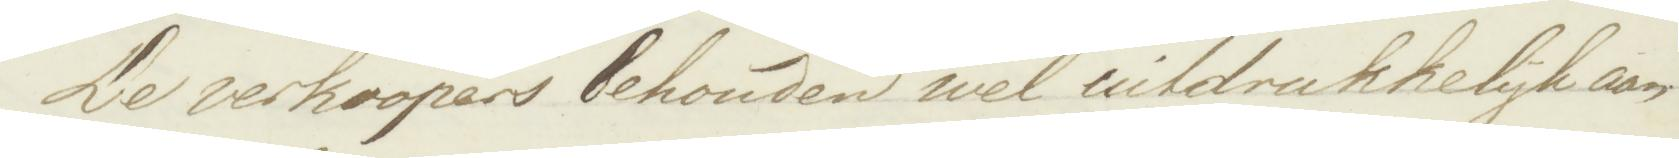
De verkoopers behouden wel uitdrukkelijk aan
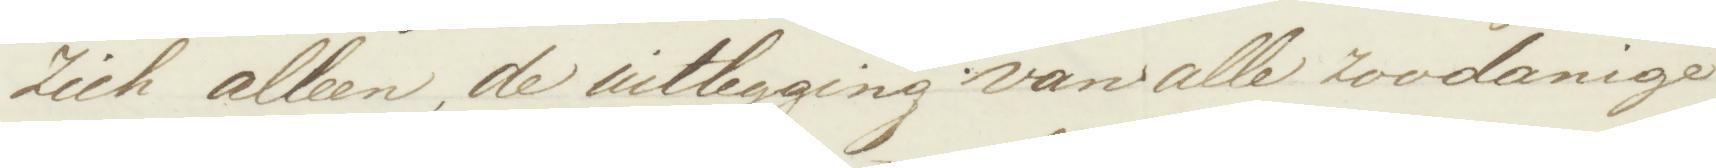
zich alleen, de uitlegging van alle zoodanige
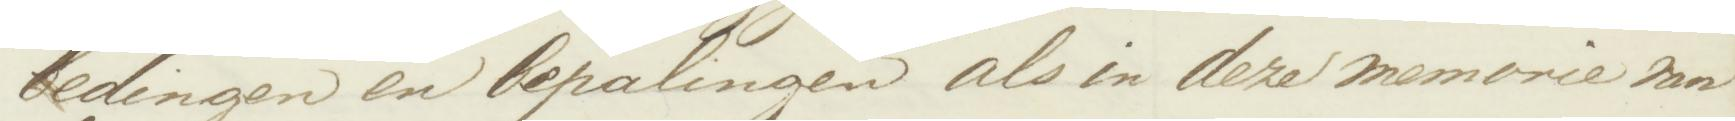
bedingen en bepalingen als in deze memorie van
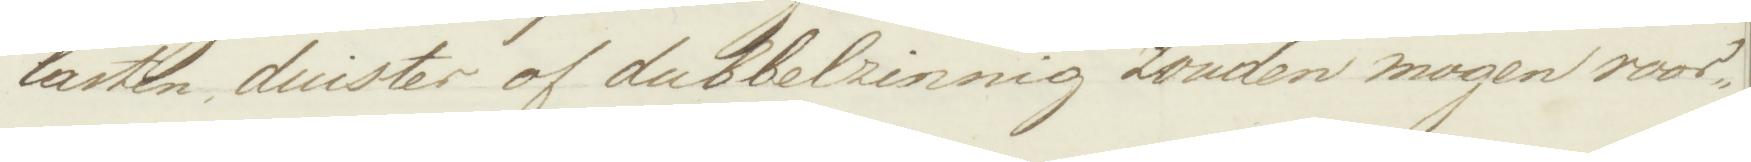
lasten, duister of dubbelzinnig zouden mogen voor„
